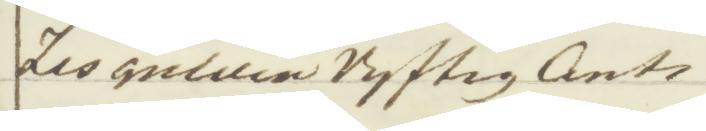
Zes gulden Vyftig Cents
